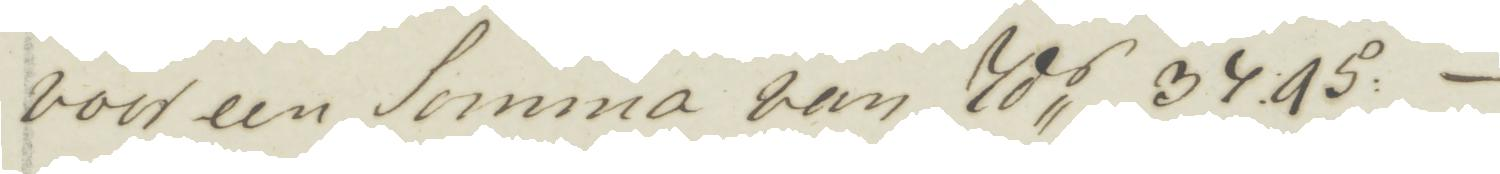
voor een somma van rd„s 3745: —
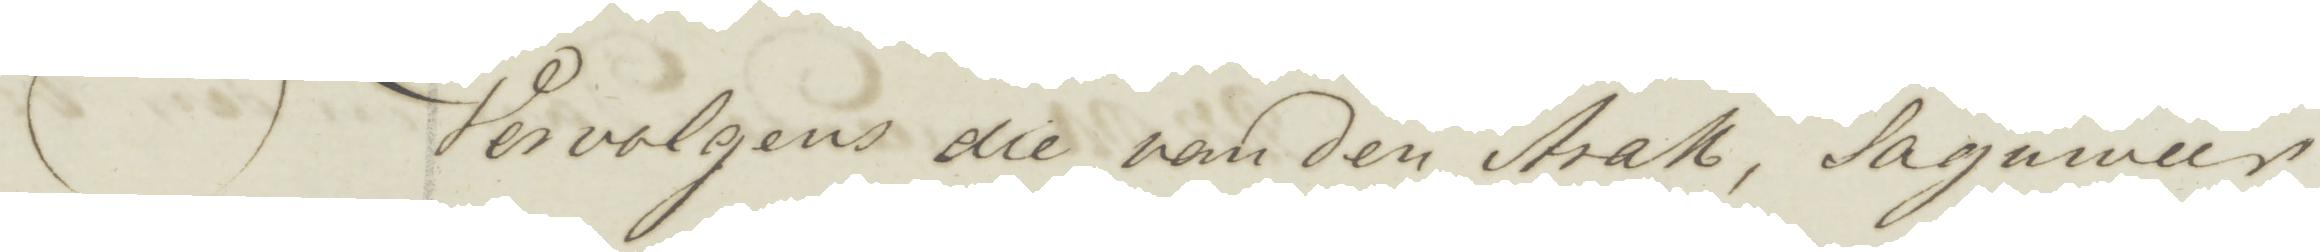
Vervolgens die van den Arak, saguweer
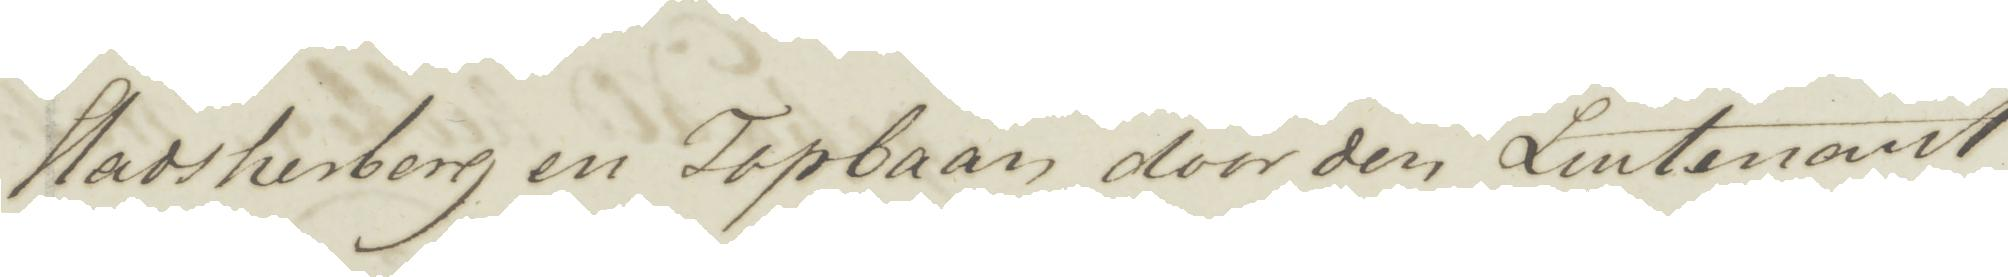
stadsherberg en Topbaan door den Luitenant
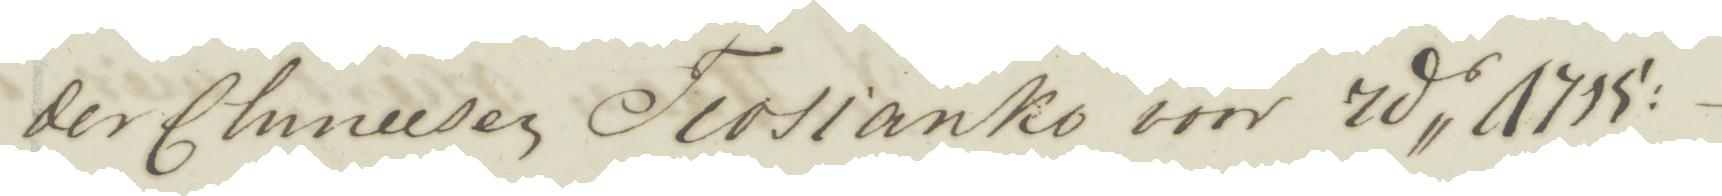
der Chineesen Tiosianko voor rd„s 4715: —
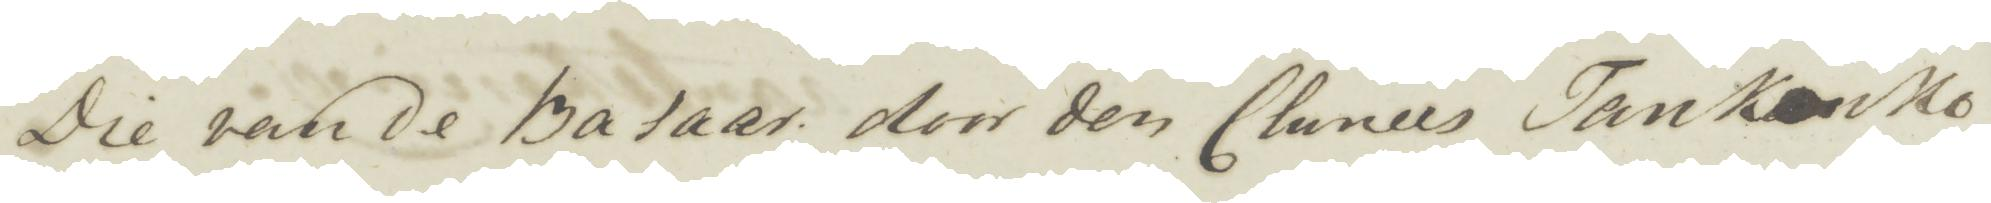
Die van de Basaar door den Chinees Tankonko
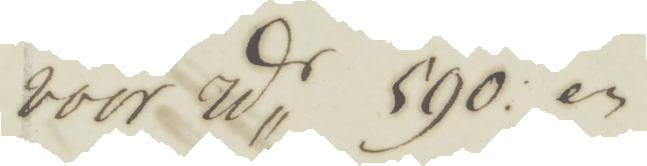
voor rd„s 590: en
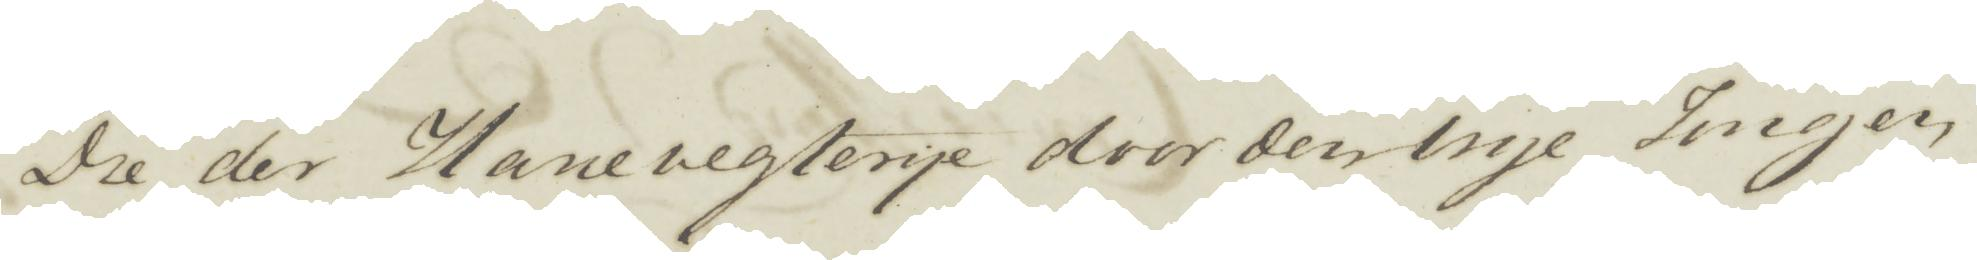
Die der Hanevegterije door den nije Iongen
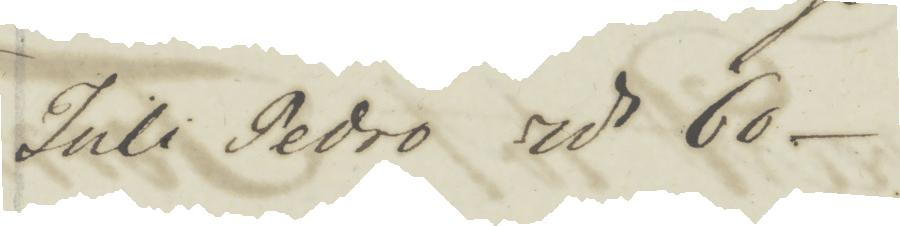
Iuli Pedro rds 60 —
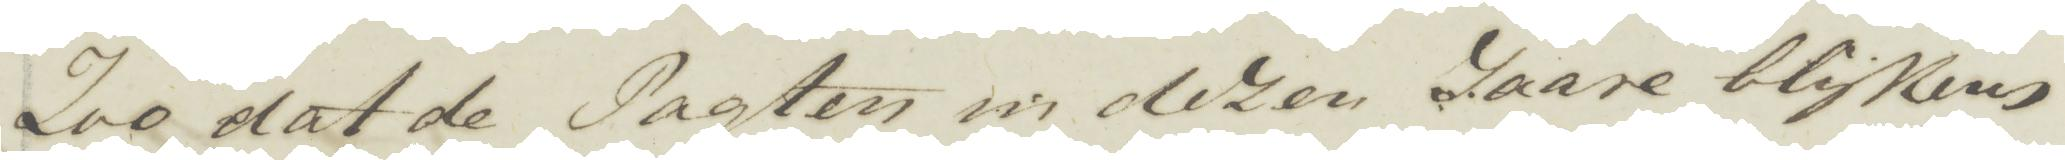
Zoo dat de Pagten in dezen Iaare blijkens
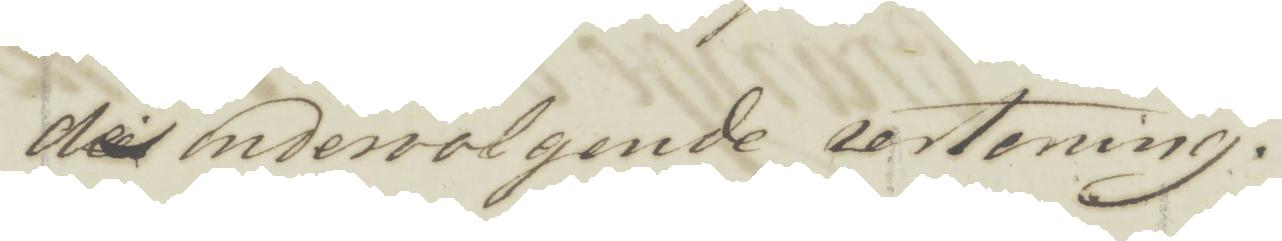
die ondervolgende restening.
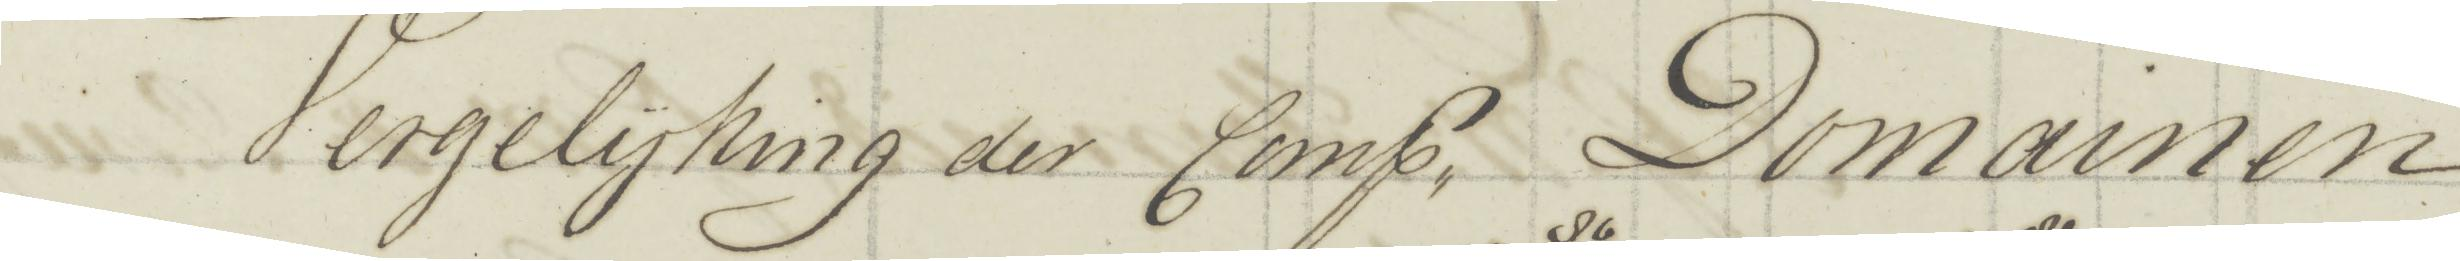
Vergelijking der Comp„s Domainen
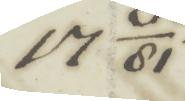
17 8/82
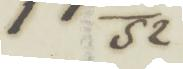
17 81/82
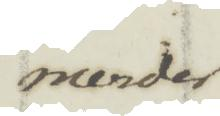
merder
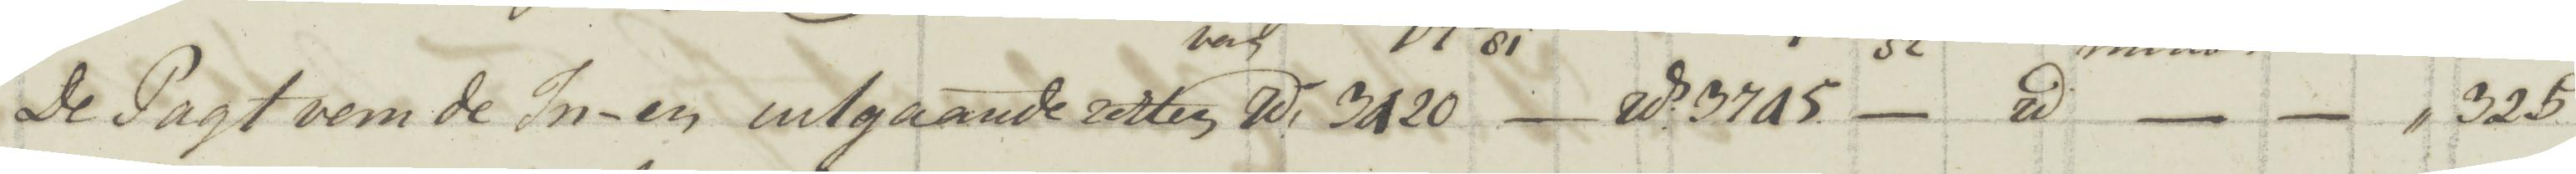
De Pagt van de In-en uitgaande resten rd:s 3420 — rd:s 3745 — rd — — „ 325
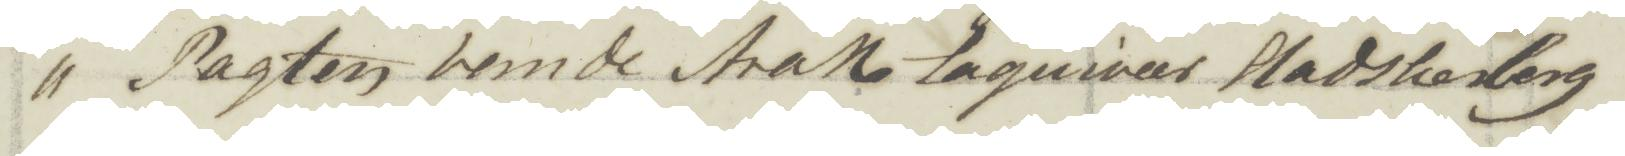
„ Pagten van de Arak taquiveer stadsherberg
